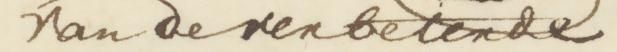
van de verbeterde
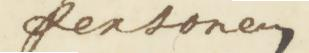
personen
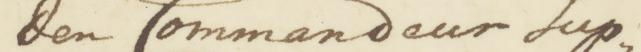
den Commandeur sup„
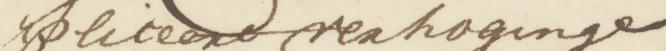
pliceerd verhoginge
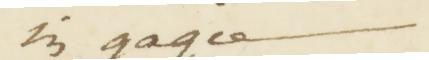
in gagie
